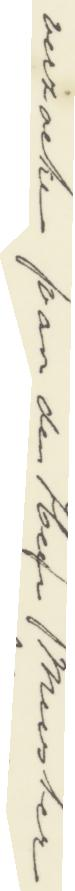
verzoeke van den Heer meester
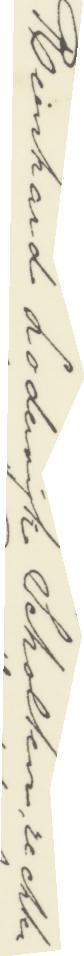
Reinhard Lodewijk Scholten, rechter
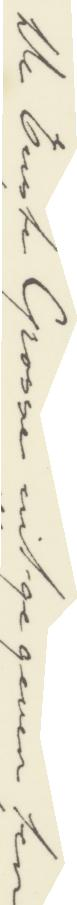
De Eerste Grosse uit-gegeven ten
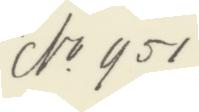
N.o 951
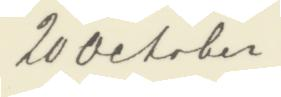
20 October
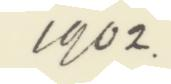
1902.
